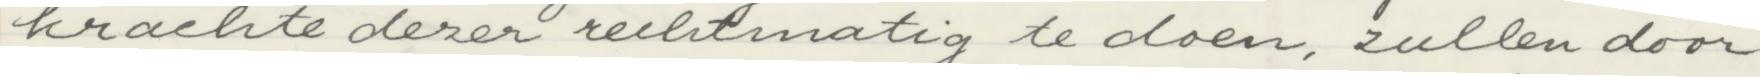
krachte dezer rechtmatig te doen, zullen door
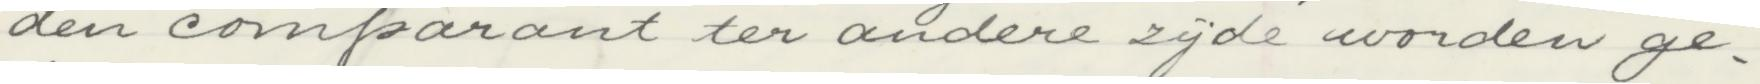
den comparant ter andere zijde worden ge-
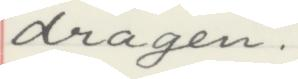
dragen.
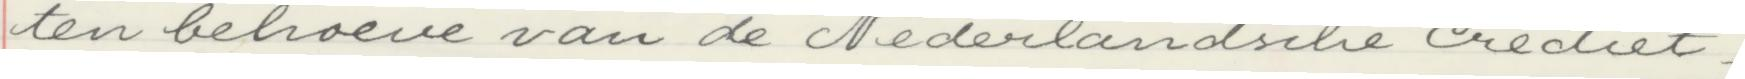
ten behoeve van de Nederlandsche Crediet
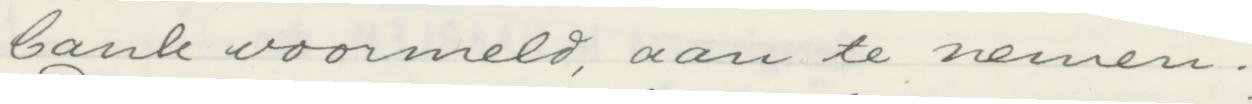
bank voormeld, aan te nemen
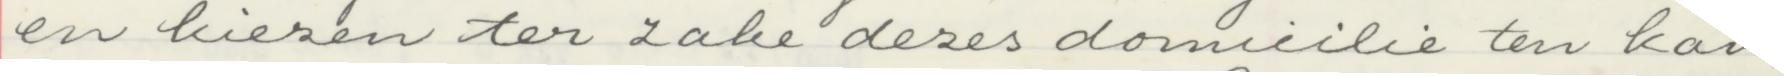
en kiezen ter zake dezes domicilie ten kan-
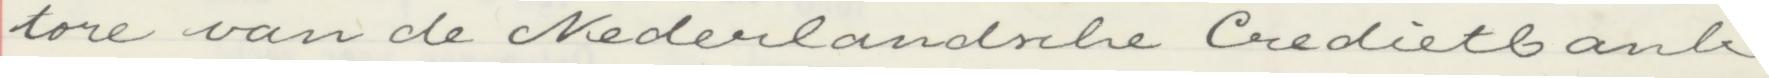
tore van de Nederlandsche Credietbank
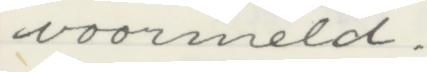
voormeld
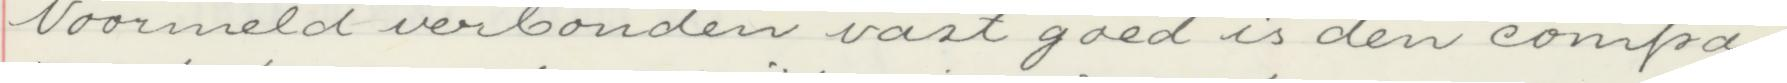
Voormeld verbonden vast goed is den compa-
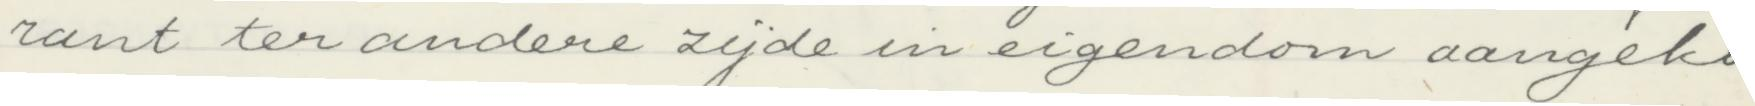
rant ter andere zijde in eigendom aangeko
